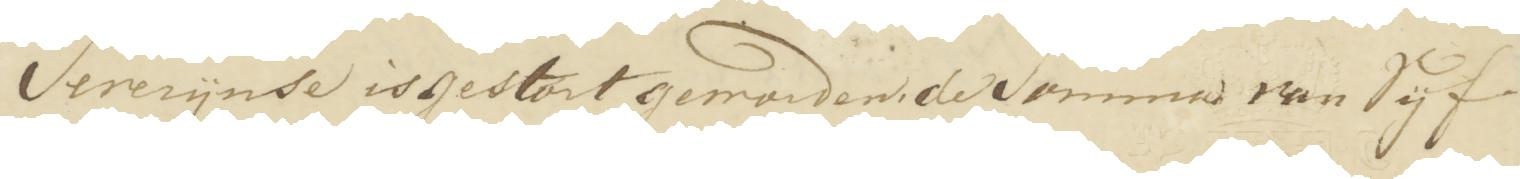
Severijnse is gestort geworden de Somma van Vijf
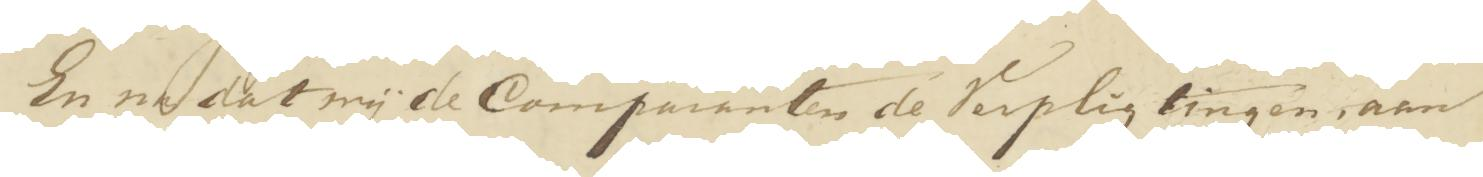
En na dat wij de Comparanten de Verpligtingen, aan
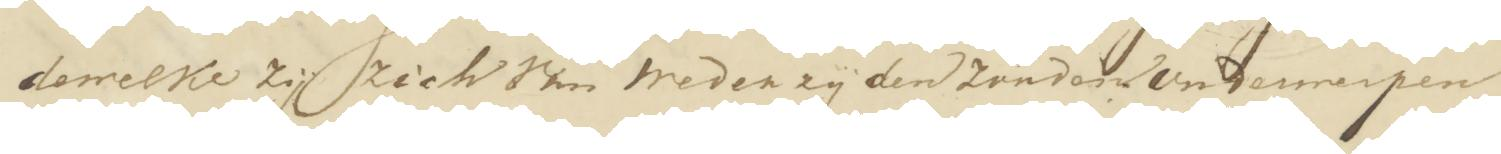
dewelke zij zich van wederzijden zonder onderwerpen
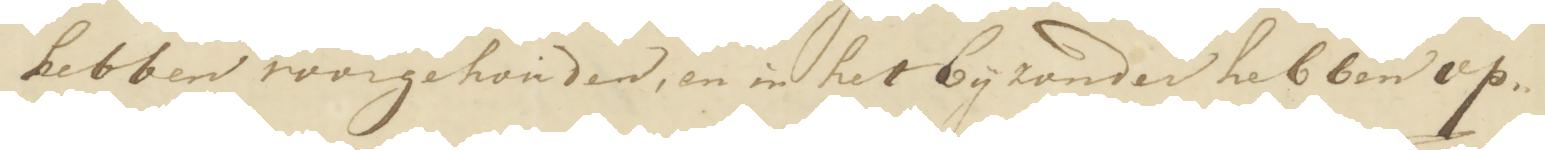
hebben voorgehouden, en in het bij zonder hebben op„
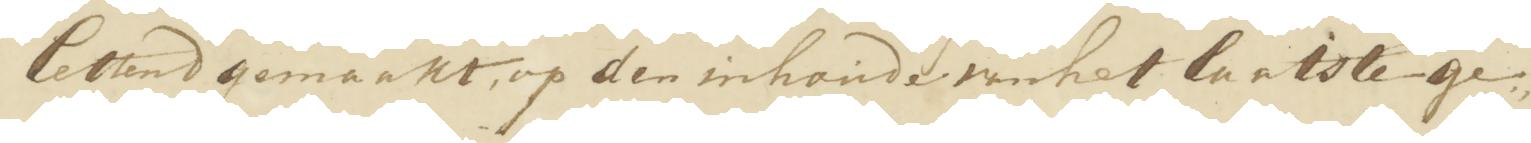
lettend gemaakt, op den inhoude van het laatste ge„
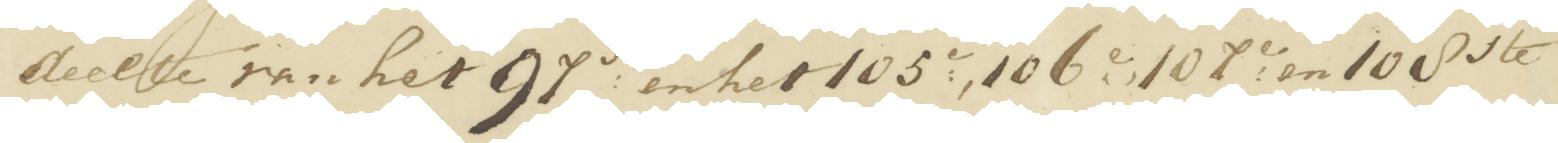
deelte van het 97:ste en het 105:e, 106:e, 107:e en 108ste
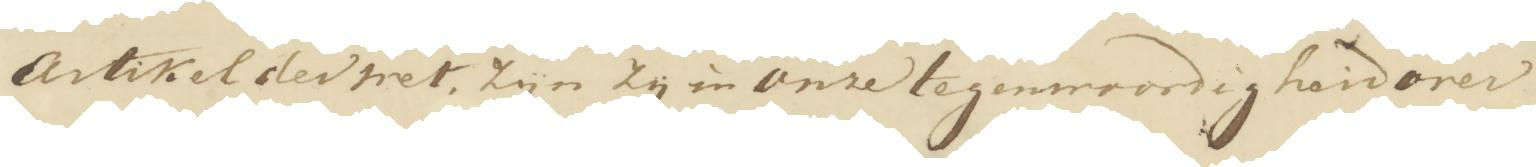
artikel der wet, zijn zij in onze tegenwoordigheid over
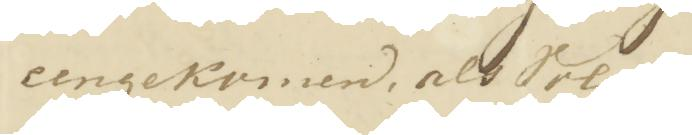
eengekomen, als volgt:
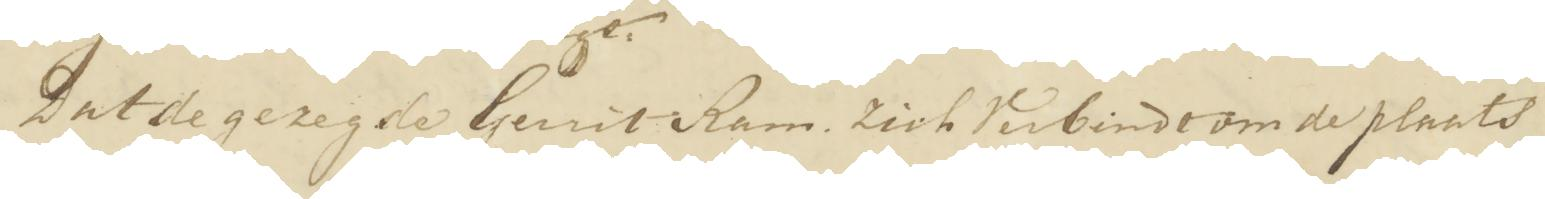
Dat de gezegde Gerrit Ram, zich verbindt om de plaats
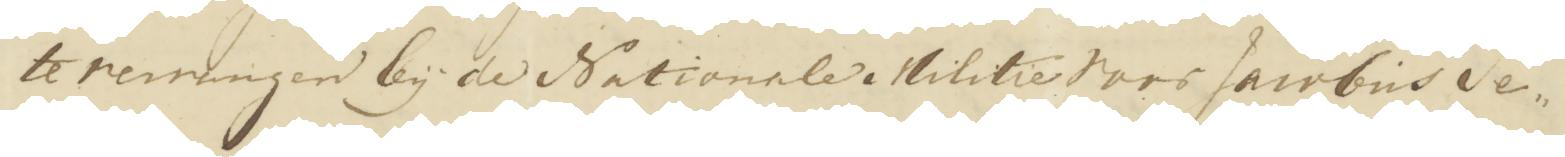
te vervangen bij de Nationale Militie voor Jacobus Se„
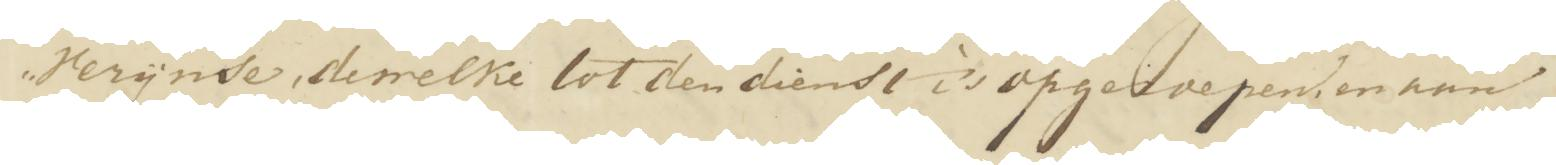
„verijnse, dewelke tot den dienst is opgeroepen, en aan
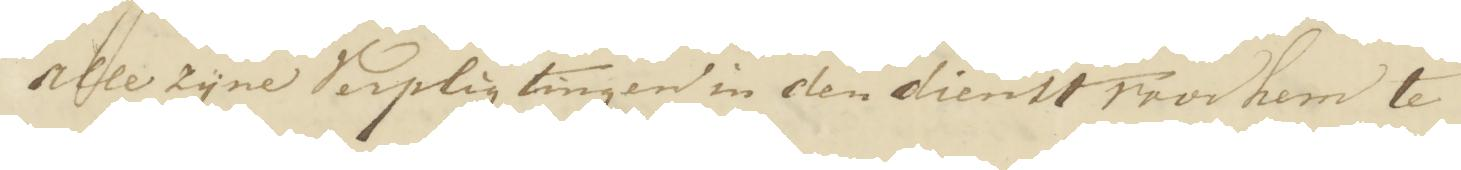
alle zijne Verpligtingen in den dienst voor hem te
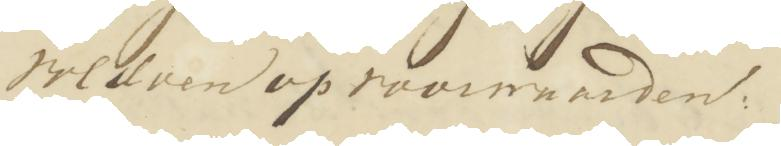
voldoen op voorwaarden:
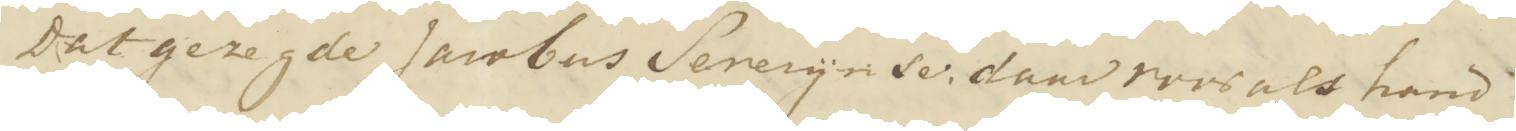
Dat gezede Jacobus Severijnse, daar voor als hand
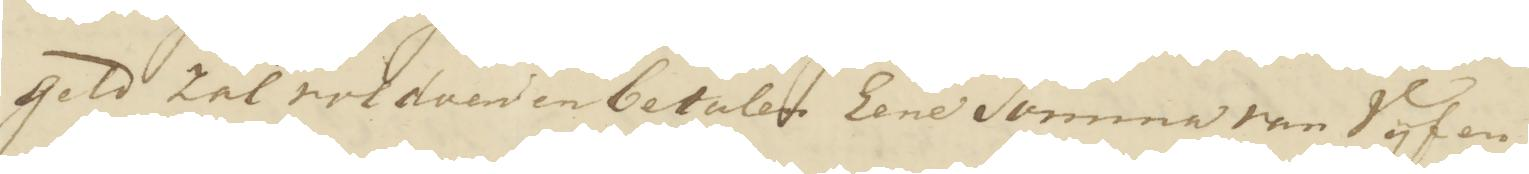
geld zal voldoen en betalen Eene somma van Vijf en
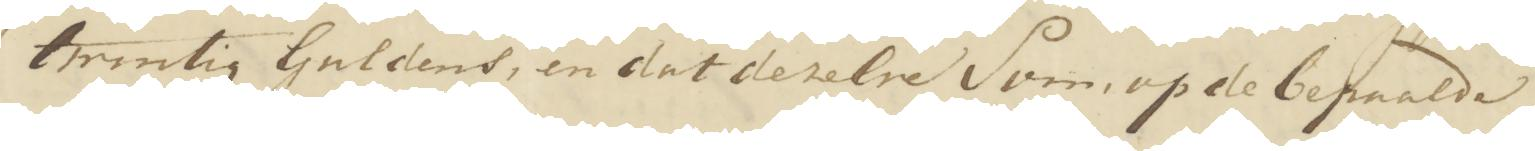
twintig Guldens, en dat dezelve Som, op de bepaalde
